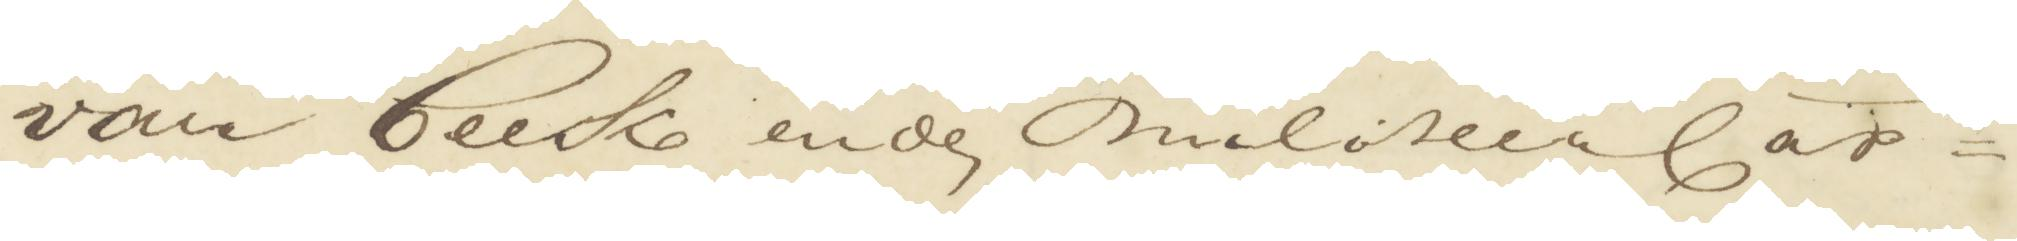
van beeck en den militeer cap=n
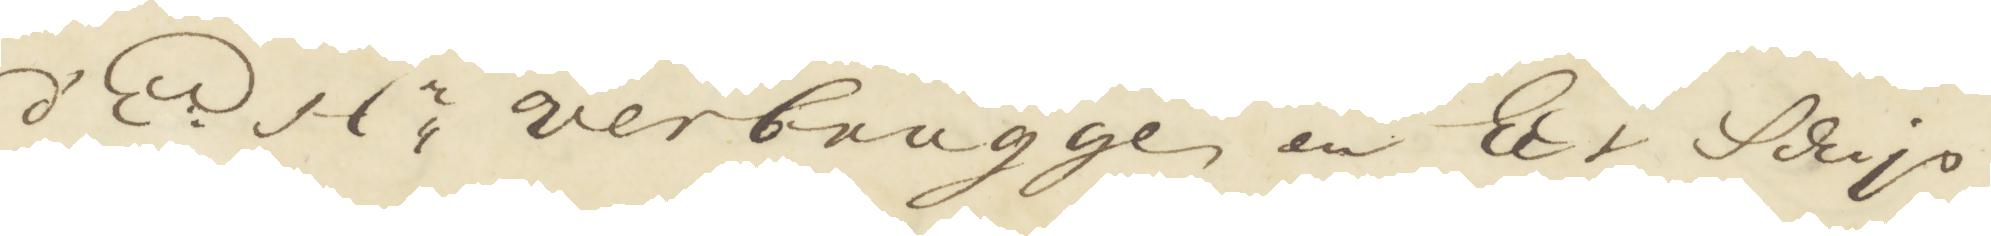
d’E: H„r verbruggen en het schip
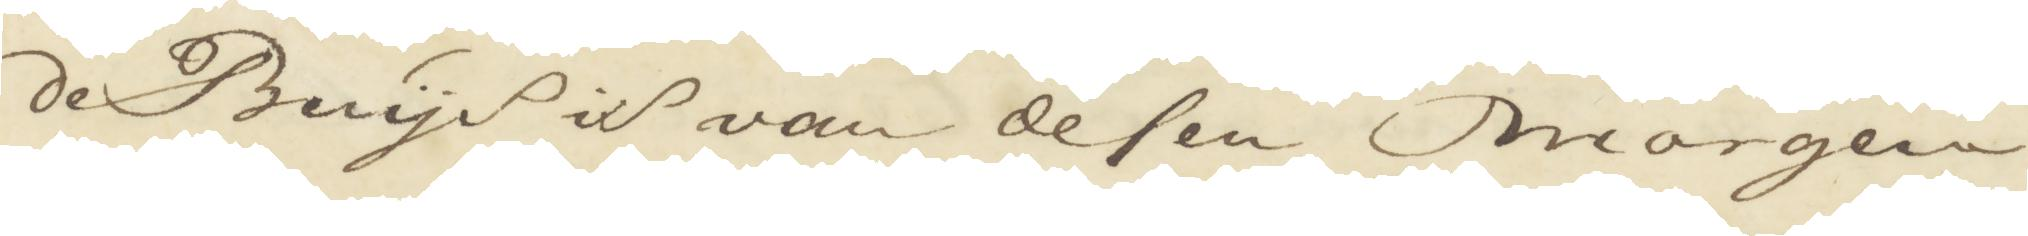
de Buijs is van desen morgen
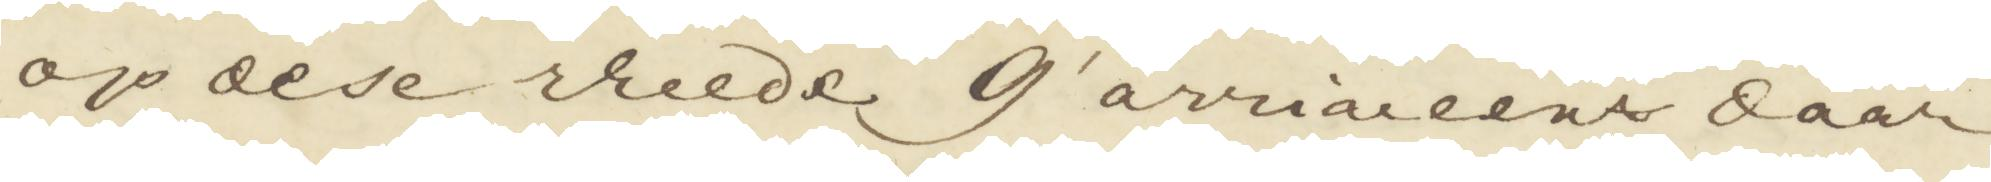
op dese rheede g'arriveert daar
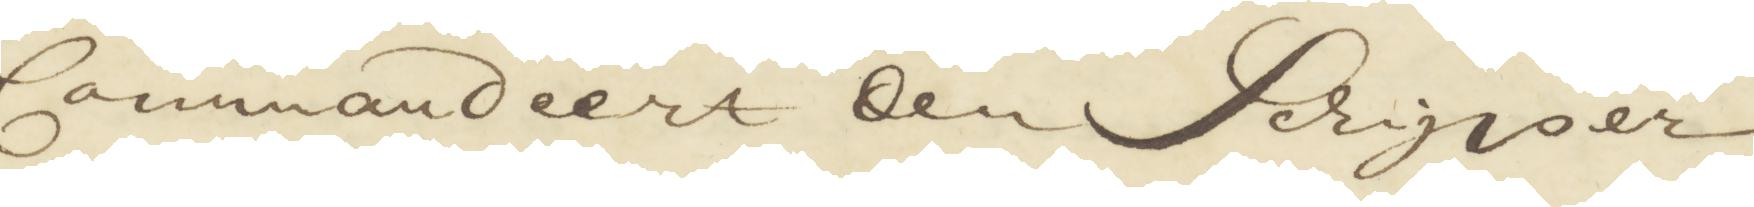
commandeert den Schipper
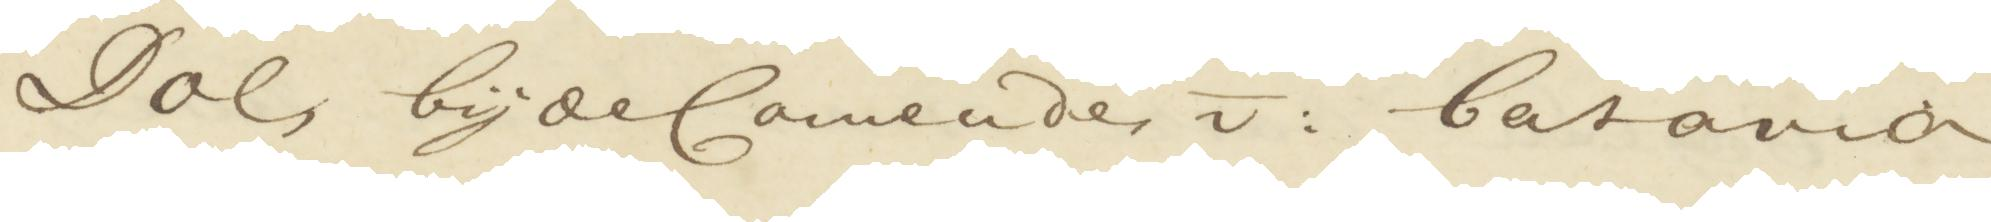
Dol, bij de Comende v: batavia
